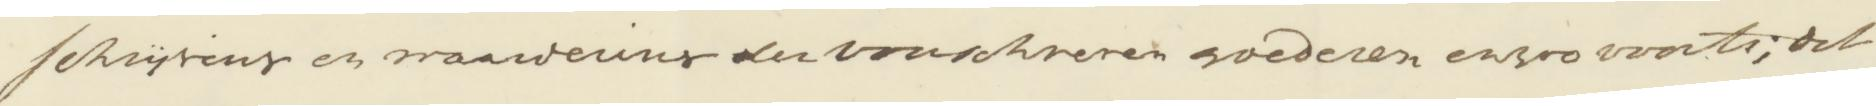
schrijving en waardering der voorschreven goederen enzoo voorts; dit
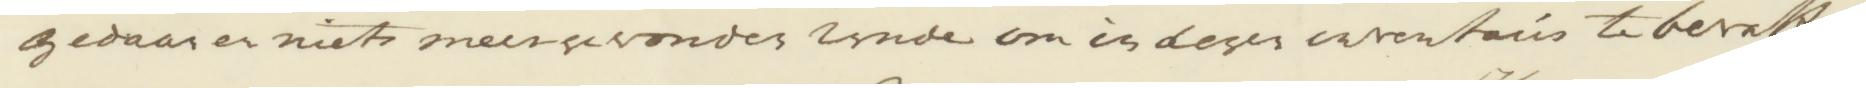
gedaan en niets meer gevonden zynde om in dezen inventaris te bevatten
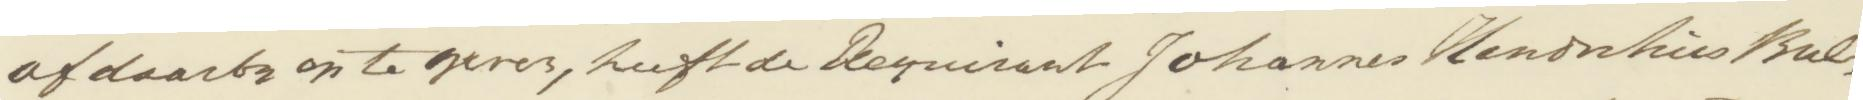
of daarby op te geven, heeft de Requirant Johannes Hendrikus Bul
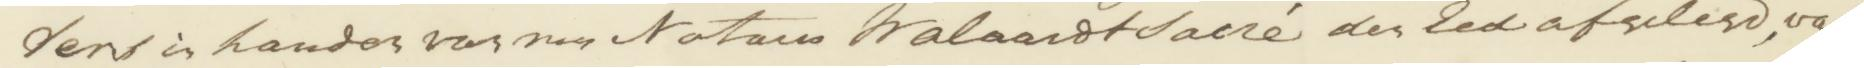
ters in handen van my Notaris Walaardt Sacré den Eed afgelegd, van
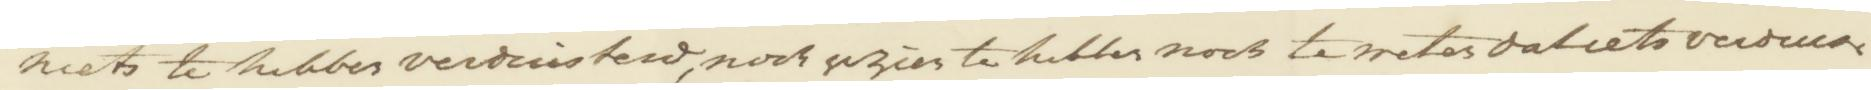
niets te hebben verduisterd, noch gezien te hebben noch te weten dat iets verdui„
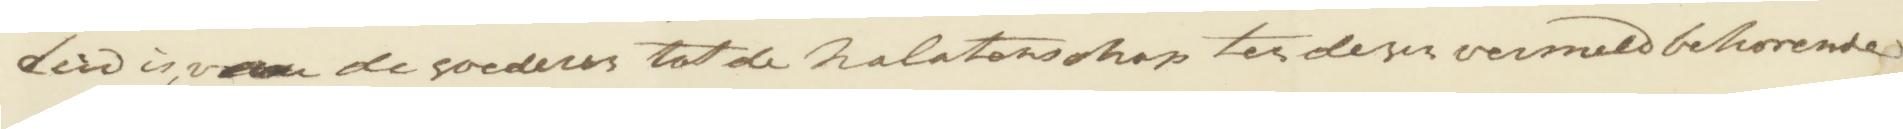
terd is, van de goederen tot de nalatenschap ten dezen vermeld behorende
